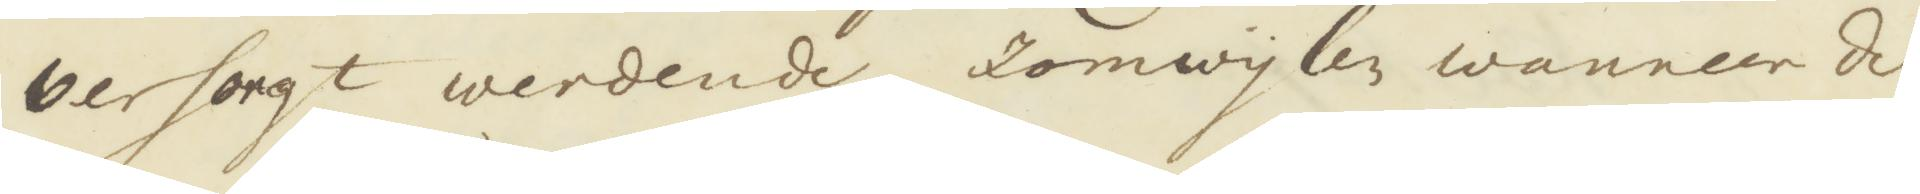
versorgt werdende, zomwijlen wanneer de
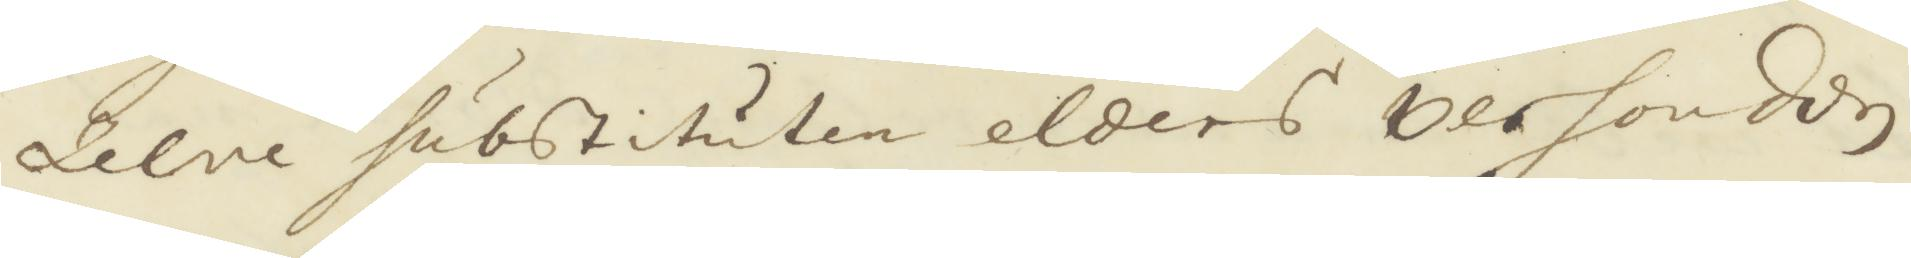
zelve substituten elders versonden
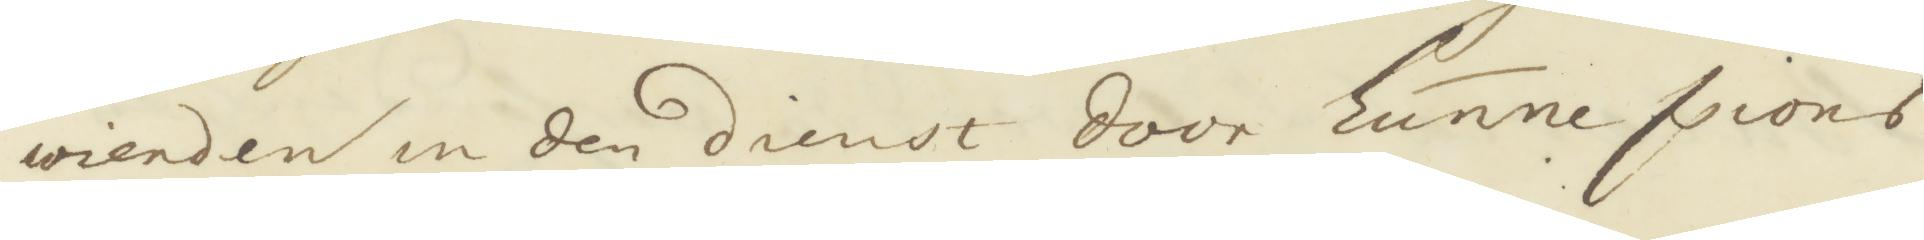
wierden in den dienst door hunne pions
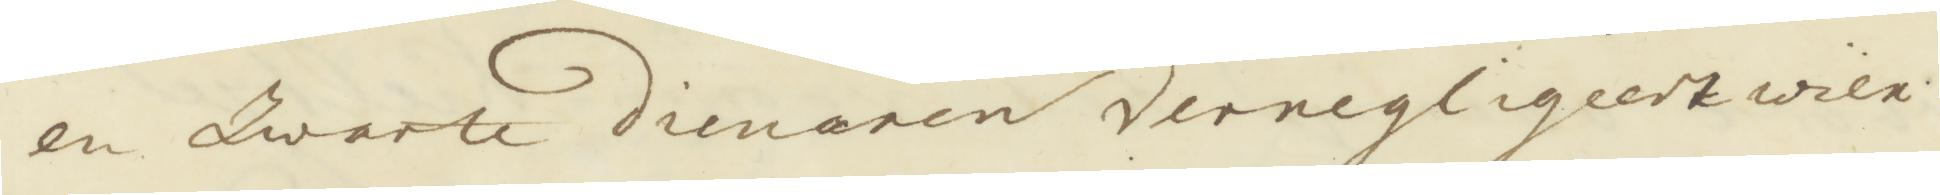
en zwarte dienaren verregtigeert wier
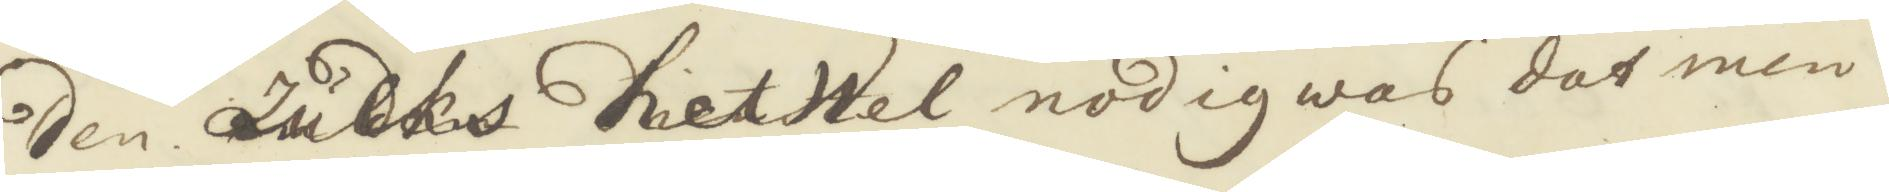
den zulks het wel nodig was dat men
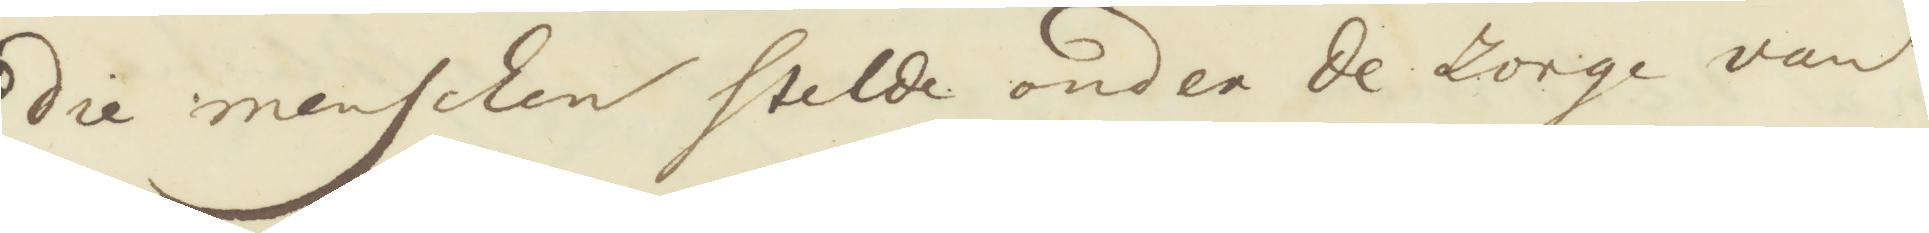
die menschen stelde onder de zorge van
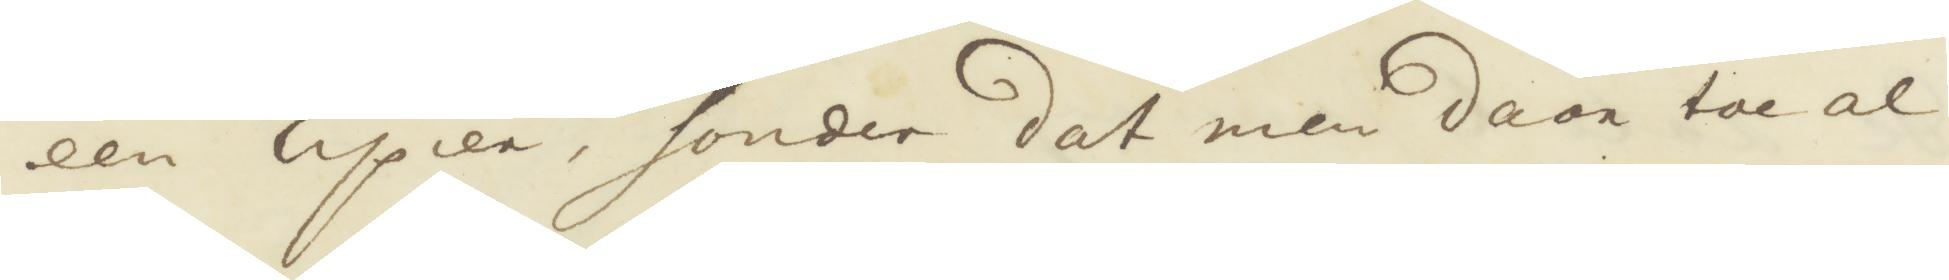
een Cipier, sonder dat men daar toe al
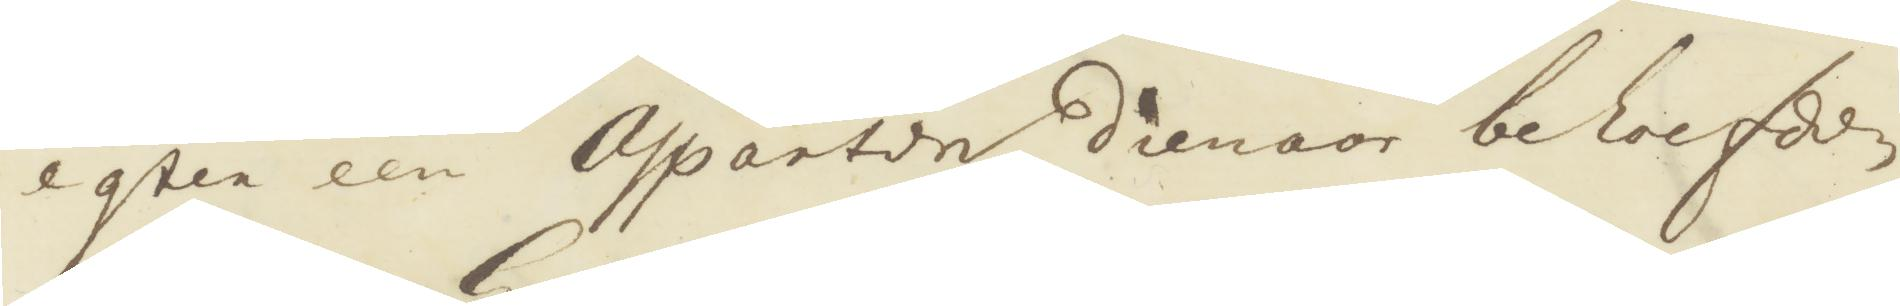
egter een apparten dienaar behoefden
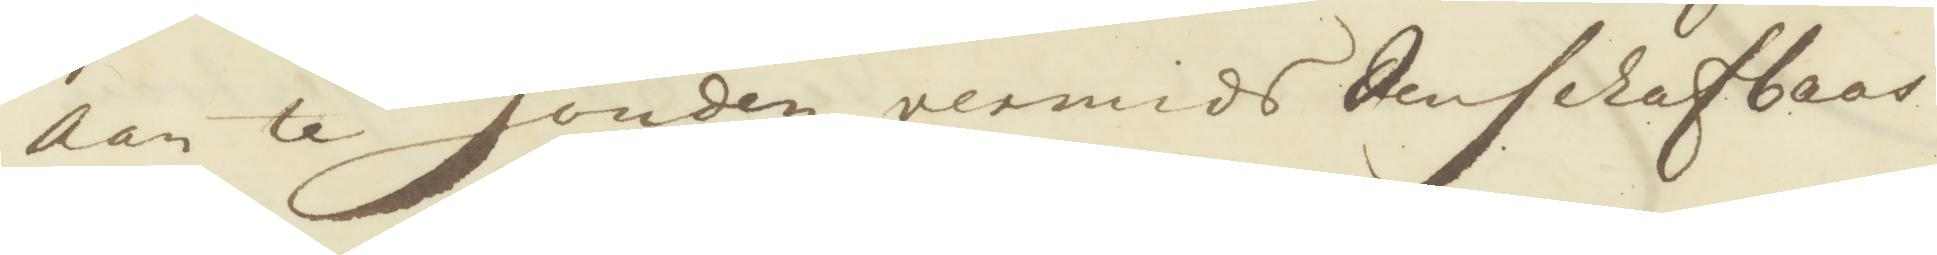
aan te houden vermids den schafbaas
